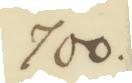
700.
